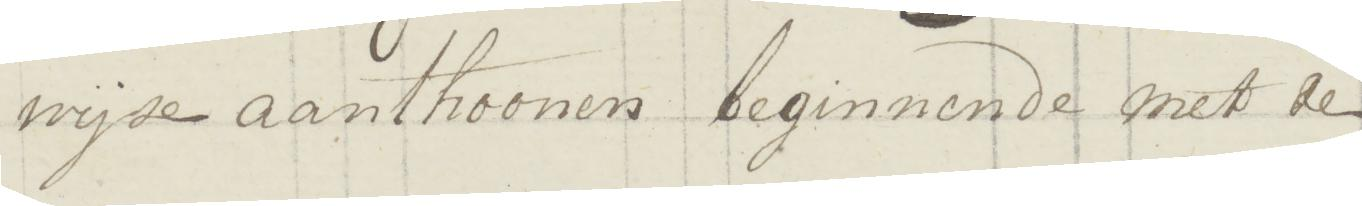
wijse aanthoonen beginnende met de
